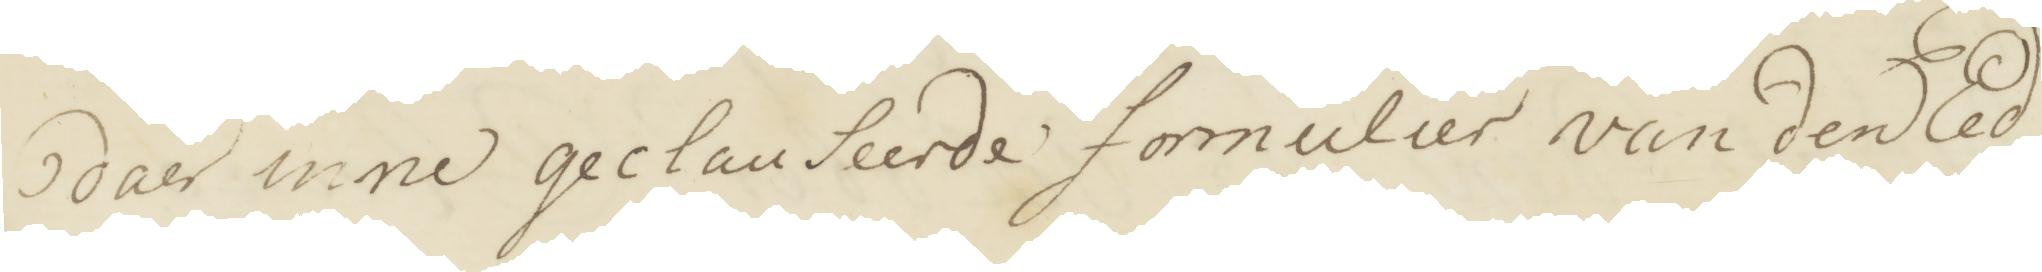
daer inne geclauseerde formulier van den Eed
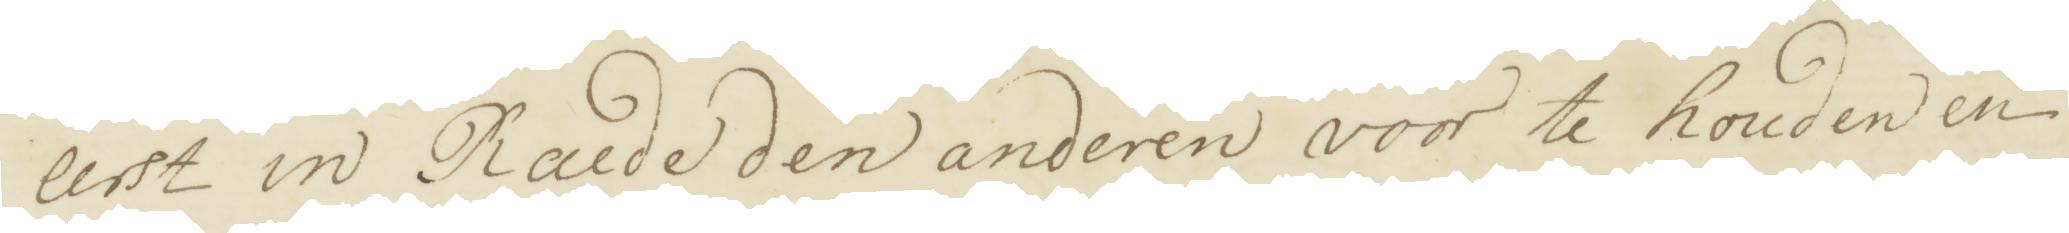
eerst in Raede den anderen voor te houden en
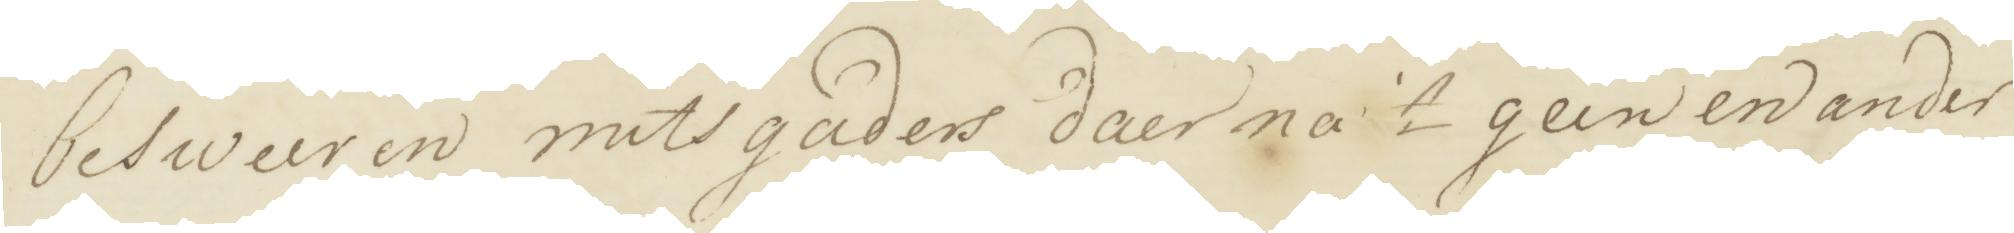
besweeren mitsgaders daer na ’t geen en ander
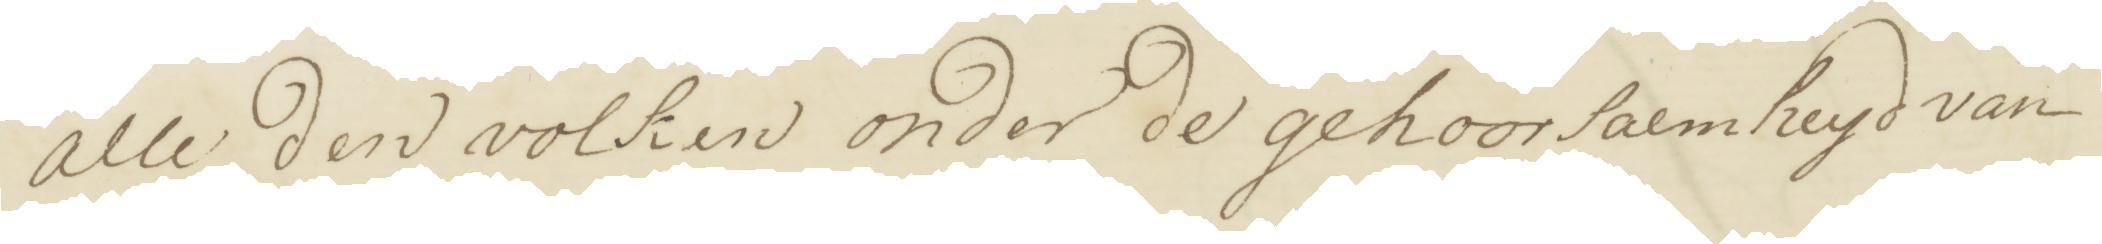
alle den volken onder de gehoorsaemheyd van
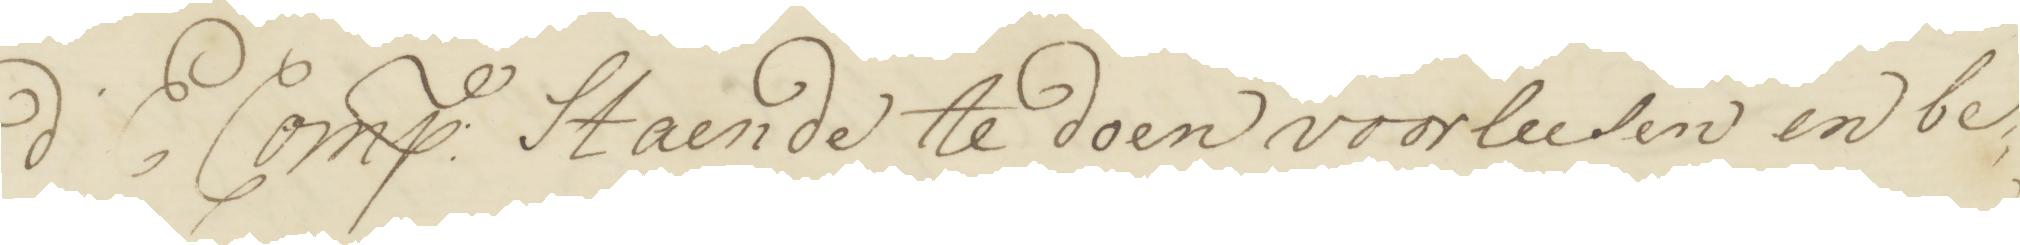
d’ E Comp:e staende te doen voorleesen en be„
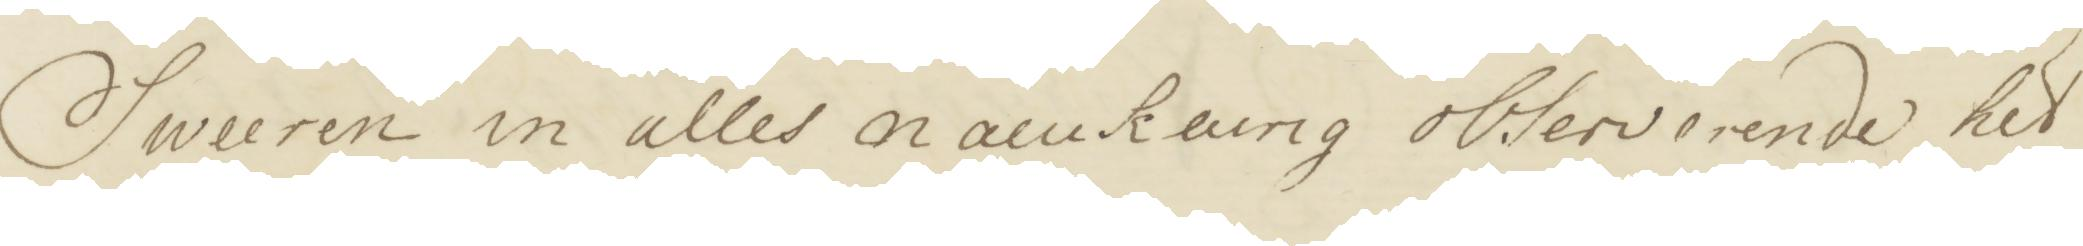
sweeren in alles naeukeurig observerende het
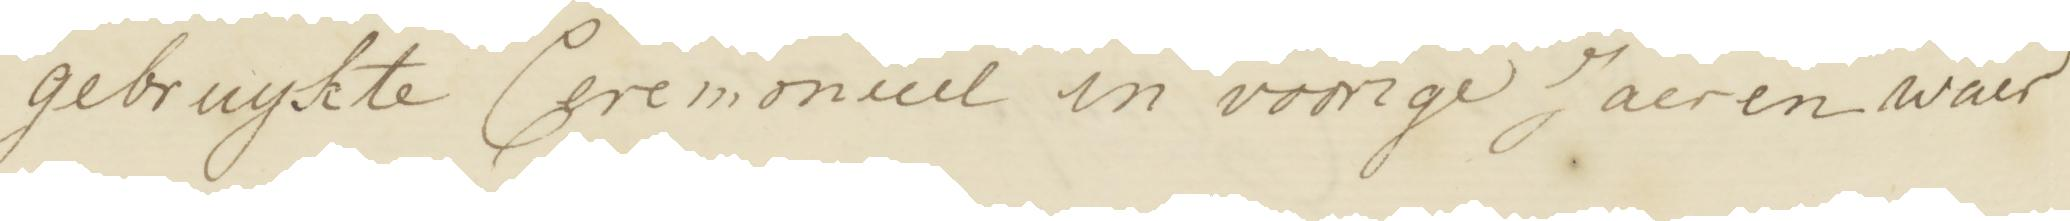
gebruykte Ceremonieel in voorige Jaeren waer
